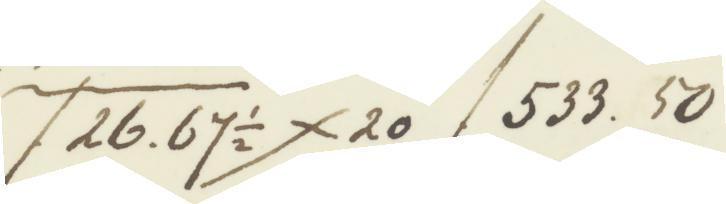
ƒ26.67½ x 20 ƒ533.50
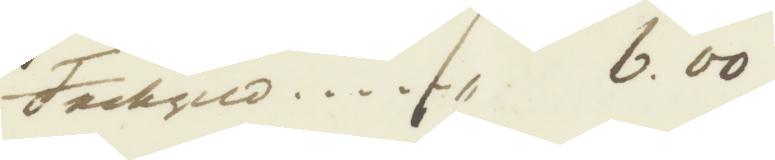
Trekgeld . . . . - „ 6.00
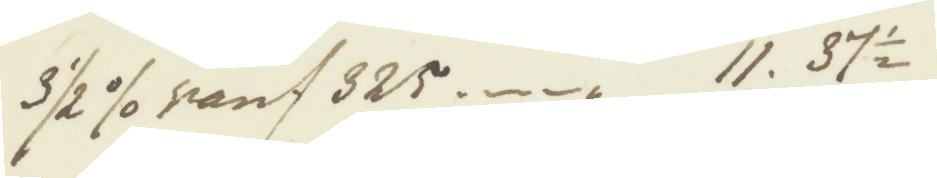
3½ % van ƒ 325. — — „ 11.37½
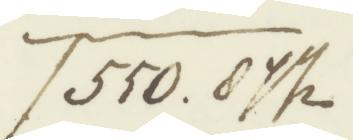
ƒ550.87½
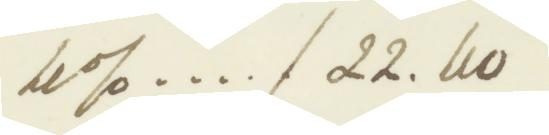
4 % . . . . ƒ22.40
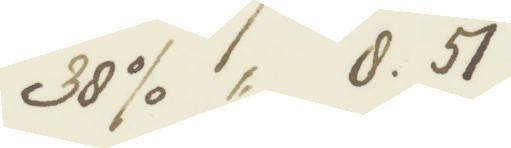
38% „ 8.57
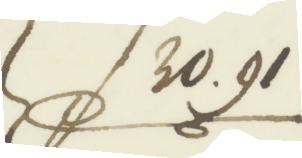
ƒ30.91
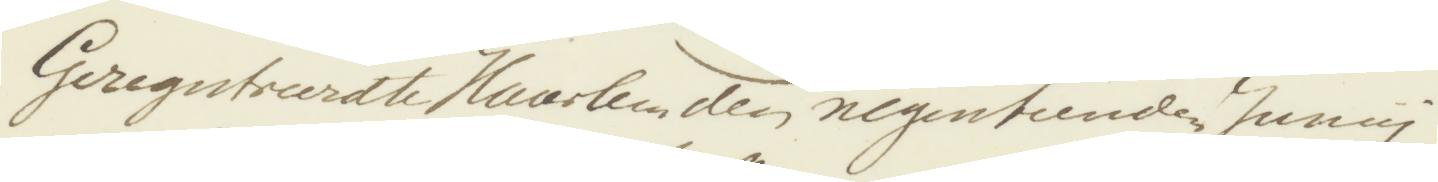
Geregistreerd te Haarlem den negentienden Junij
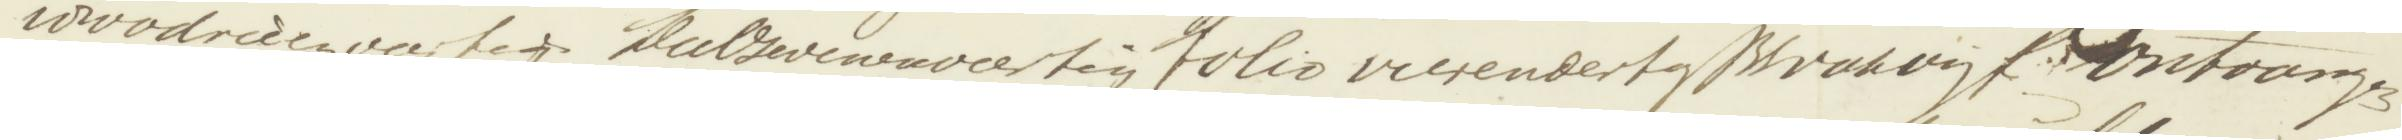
1800 drieenveertig Deel zevenenveertig folio vierendertig W vak vijf ontvange
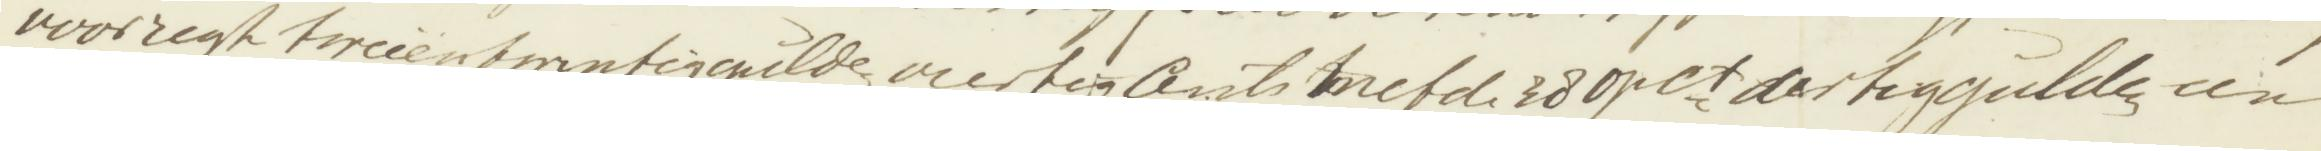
voor regt tweeëntwintig gulden veertig Cents met de 38 opct dertig gulden een
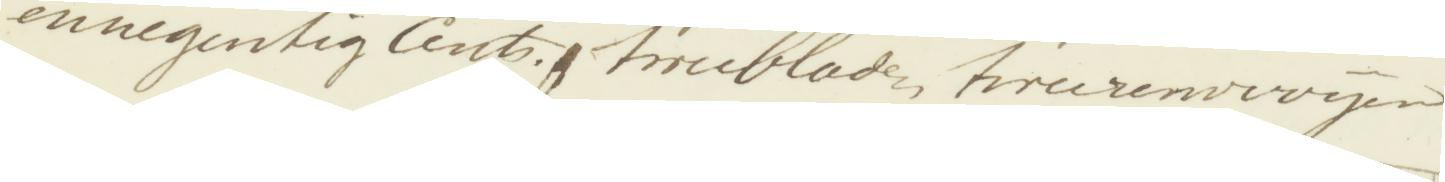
en negentig Cents. twee bladen twee renvooijen
